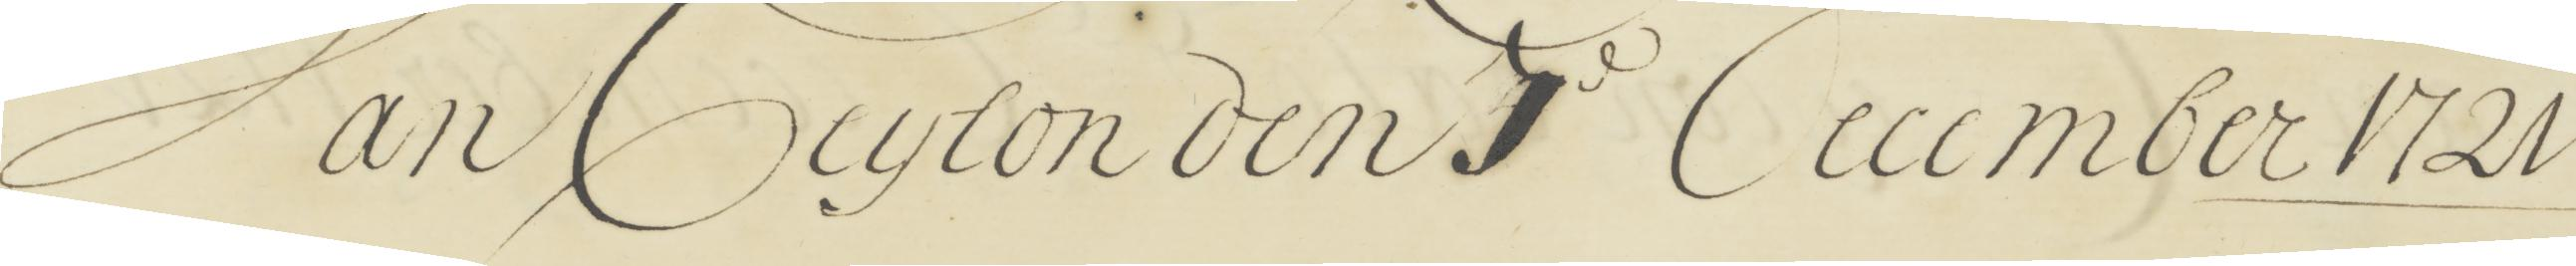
Van Ceylon den 1e december 1721
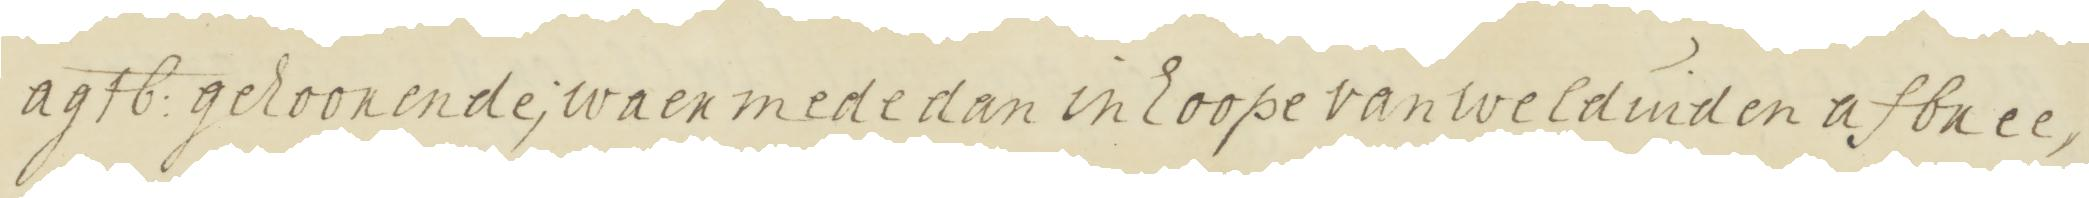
agtb: gehoorende, waer mede dan in hoope van wel duiden afbree„
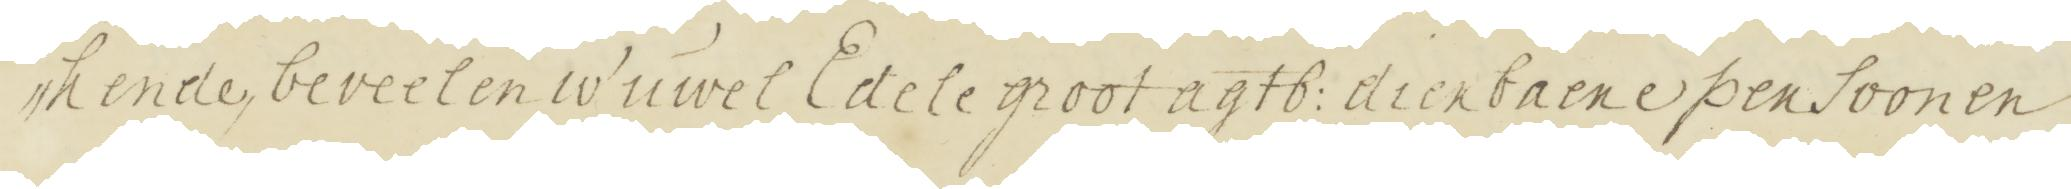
„kende, beveelen w' uwel Edele groot agtb: dierbaere persoonen
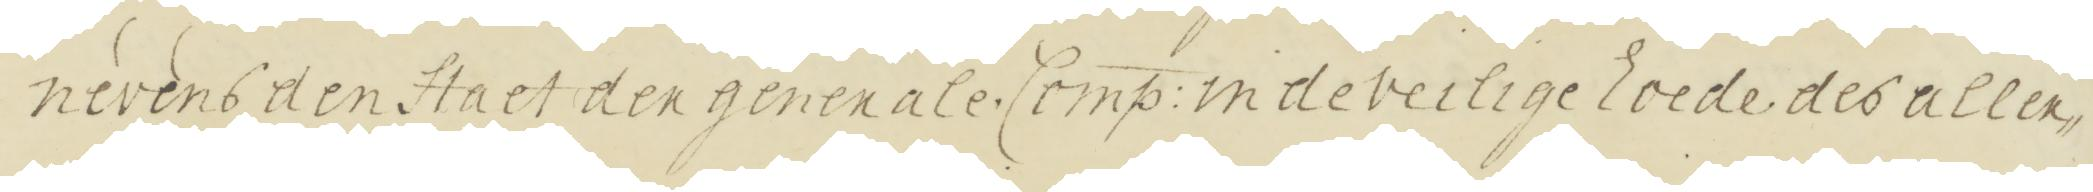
nevens den staet der generale Comp: in de veilige hoede des aller„
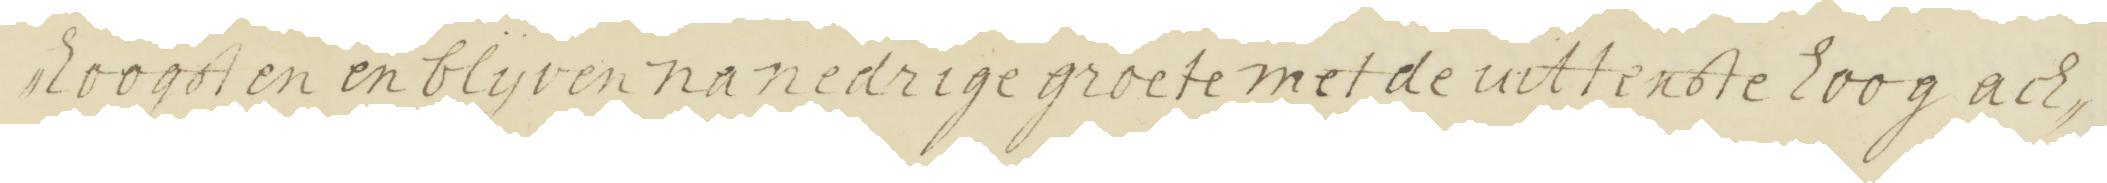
„hoogsten en blijven na nedrige groete met de uitterste hoog ach„
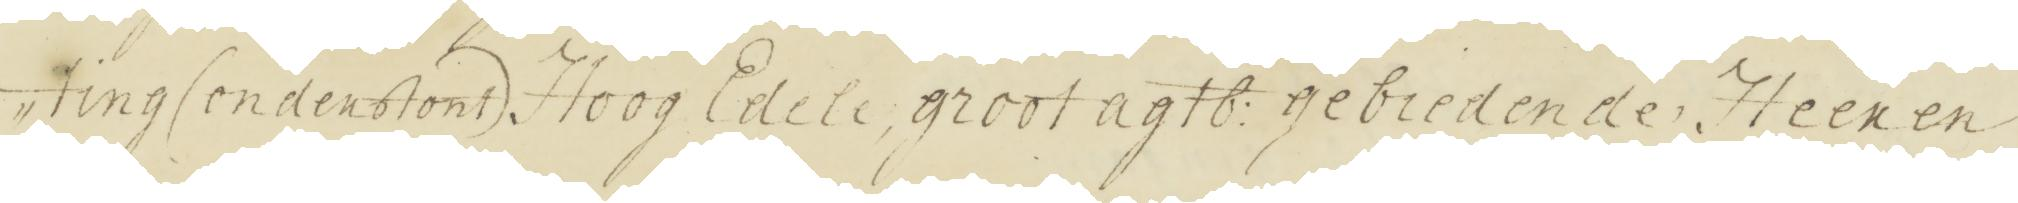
„ting (onderstont) Hoog Edele, groot agtb: gebiedende Heer en
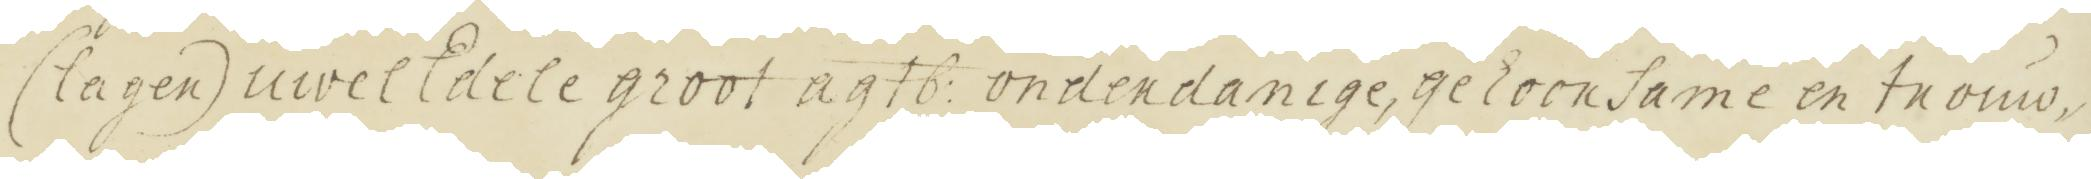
(lager) uwel Edele groot agtb: onderdanige, gehoorsame en trouw„
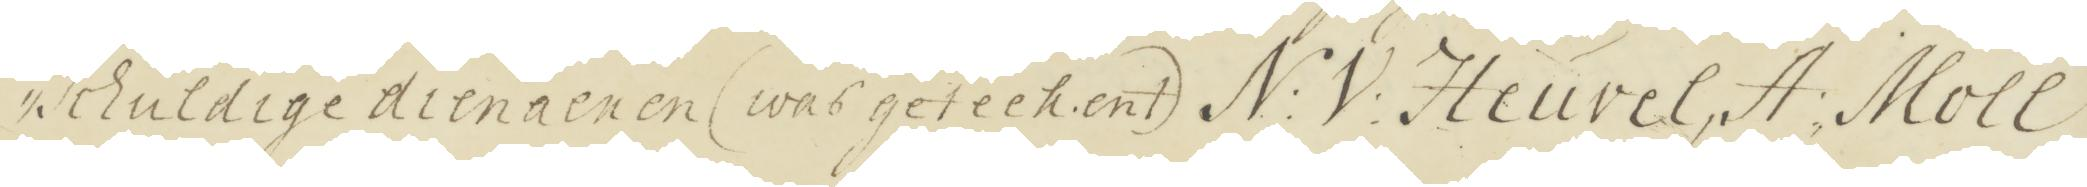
„schuldige dienaeren (was geteekent) N: V: Heuvel, A: Moll,
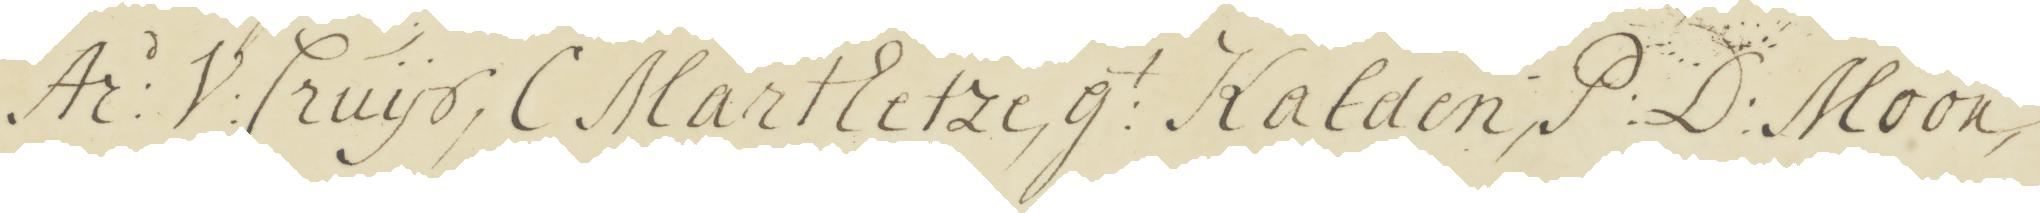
Ar:d V: Cruijs, C Marthetze, g:t Kalden, P: D: Moor,
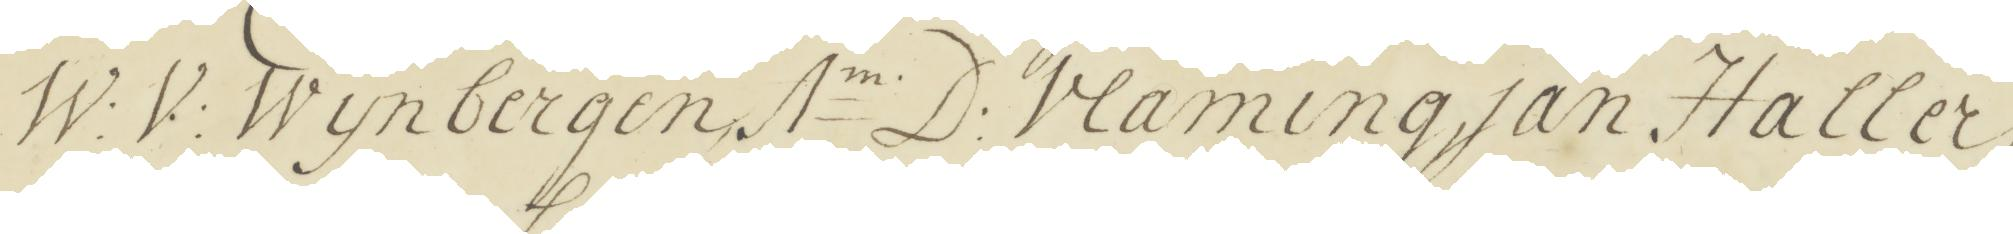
W: V: Wijnbergen, A=m D: Vlaming Jan Haller,
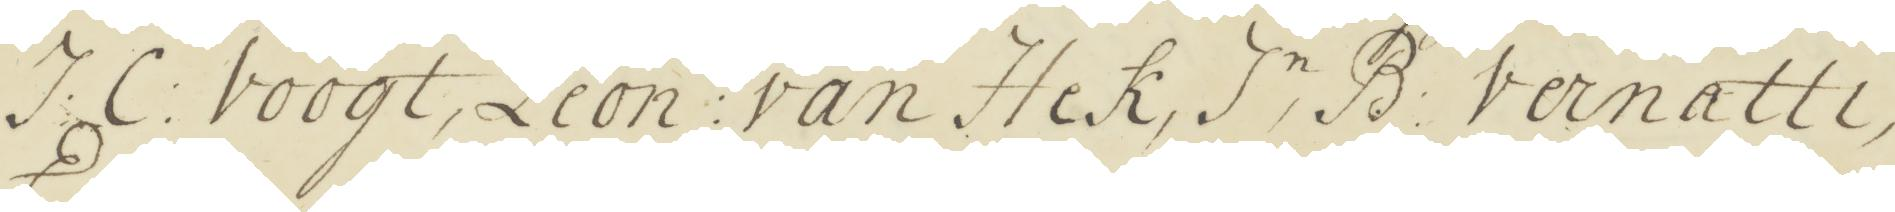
I: C: Voogt, Leon:d van Hek, I,n, B: Vernatti,
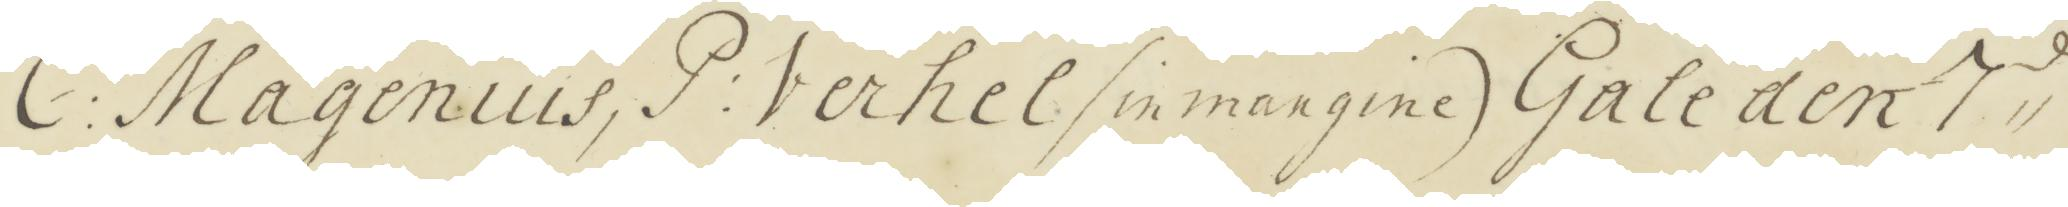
E: Magenius, P: Verhel (in margine) Gale den 7„e
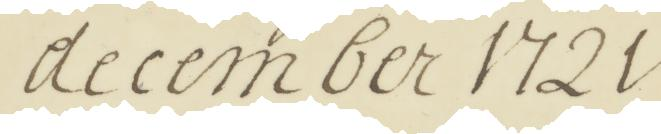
december 1721
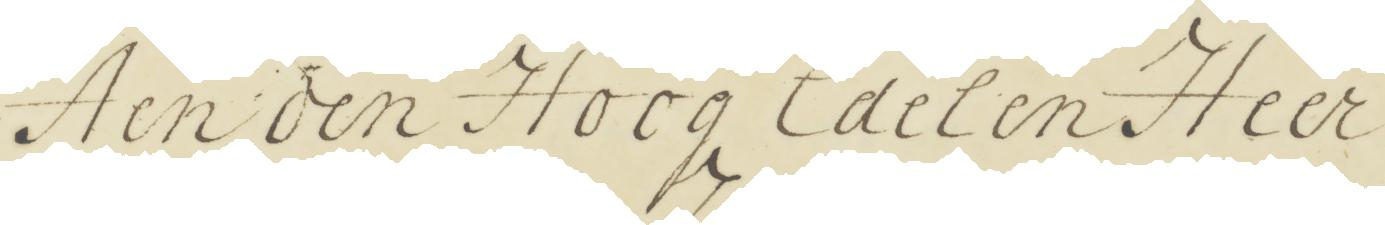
Aen den Hoog Edelen Heer
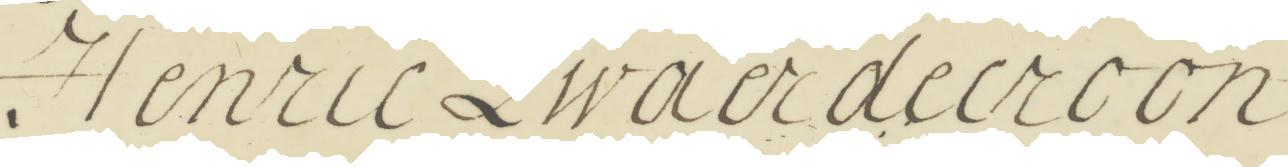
Henric Zwaerdecroon
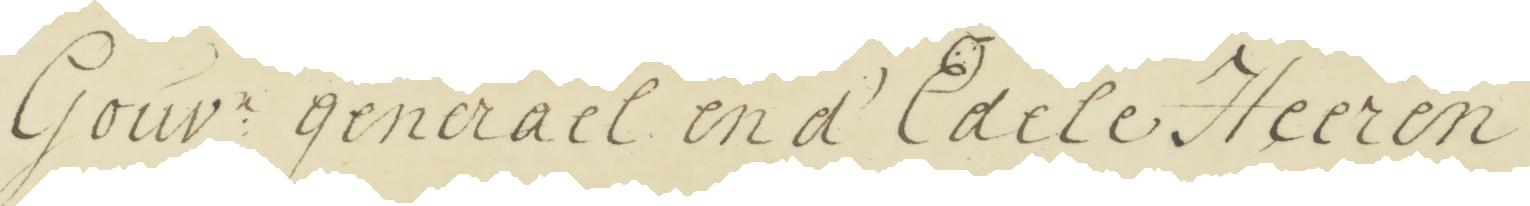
Gouv:r generael en d’ Edele Heeren
